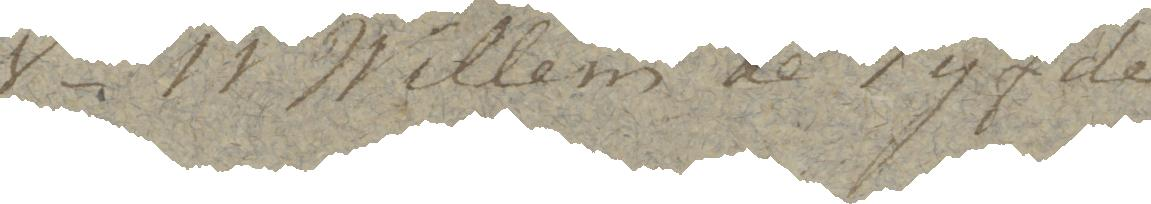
N:o 11 Willem de Vyfde
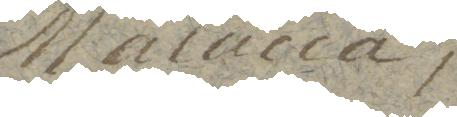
Malacca,
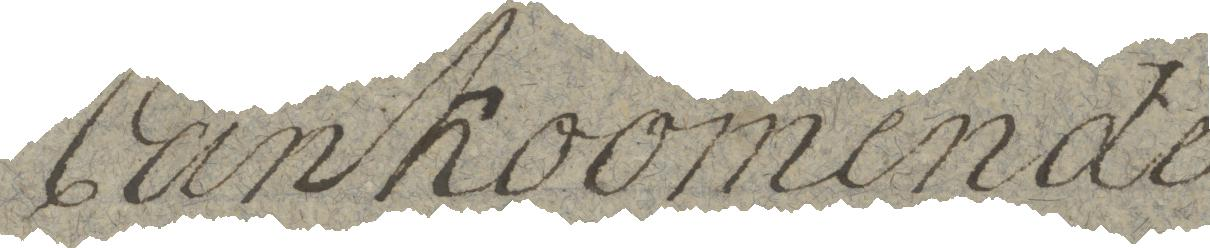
Aankoomende Brieven
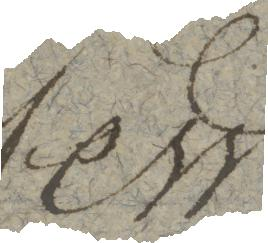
Buijten Gewesten
